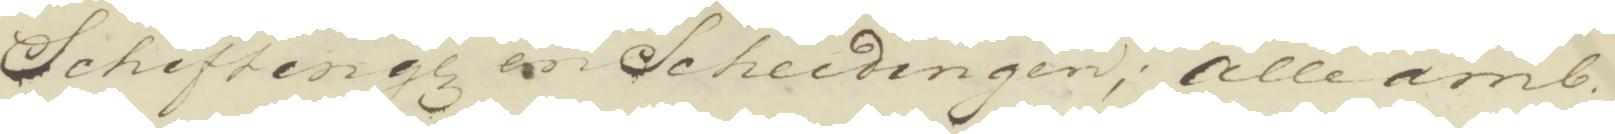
Schiftingen en scheidingen; alle amb.
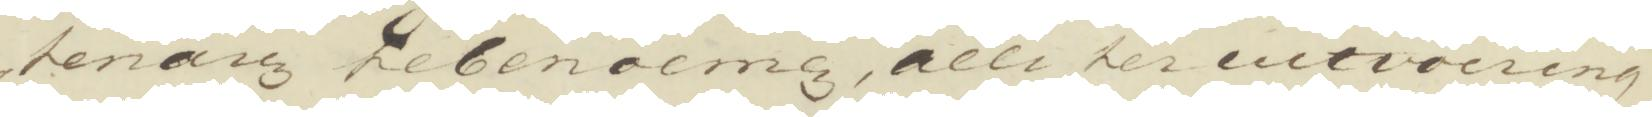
tenaren te benoemen, alle ter uitvoering
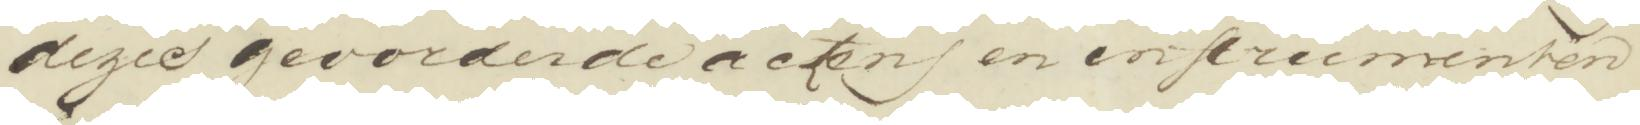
dezes gevorderde actens en instrumenten
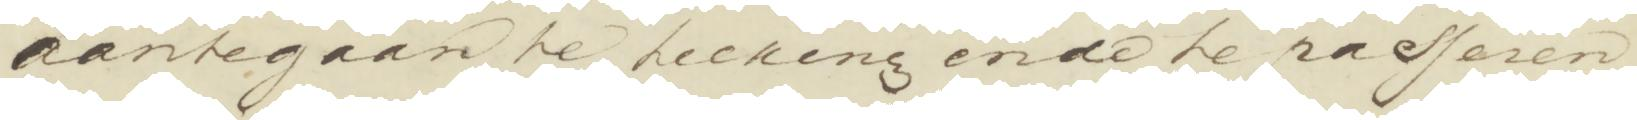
aantegaan te teekenen ende te passeren
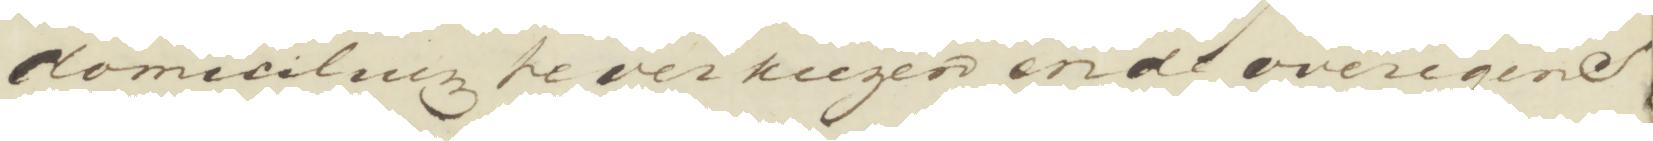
domicilium te verkiezen en de overigens
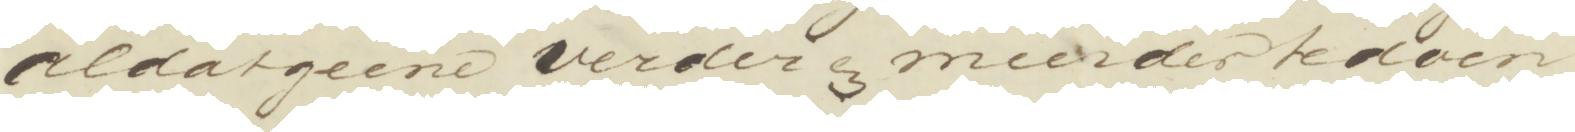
aldatgeene verder en meerder te doen
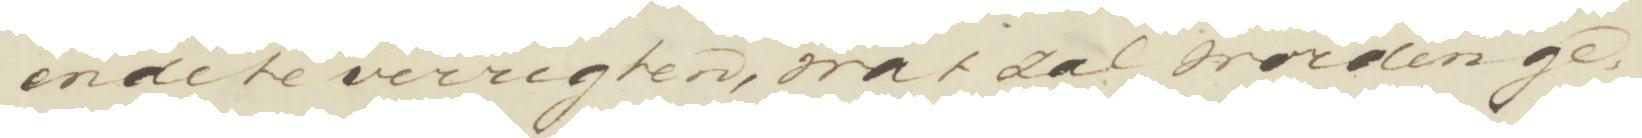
ende te verrigten, wat zal worden ge„
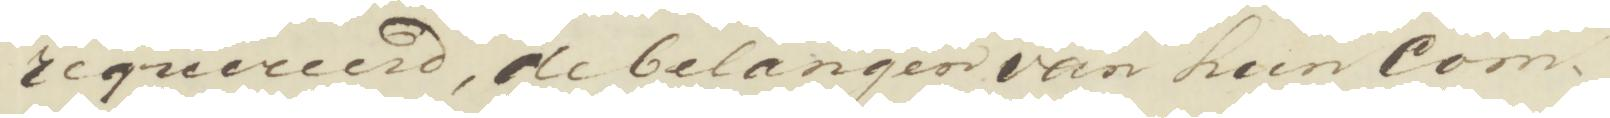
requireerd, de belangen van hun Com„
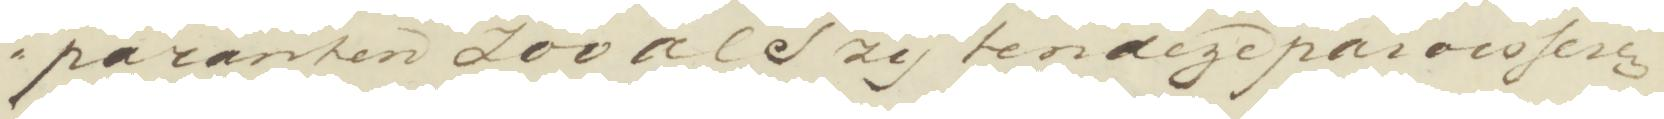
„paranten zoo als zy ten deze paroisseren
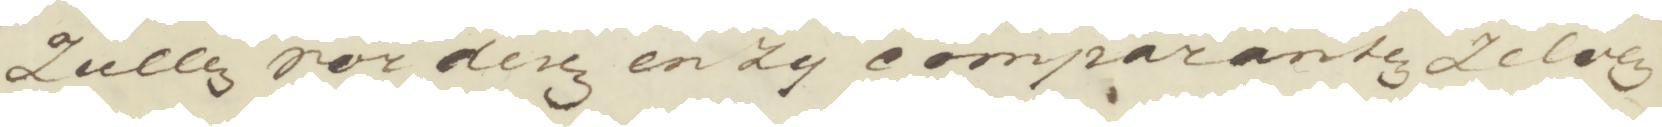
zullen vorderen en zy comparanten zelven
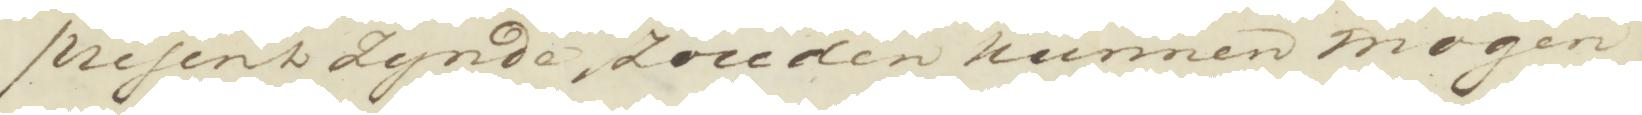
present zynde, zouden kunnen mogen
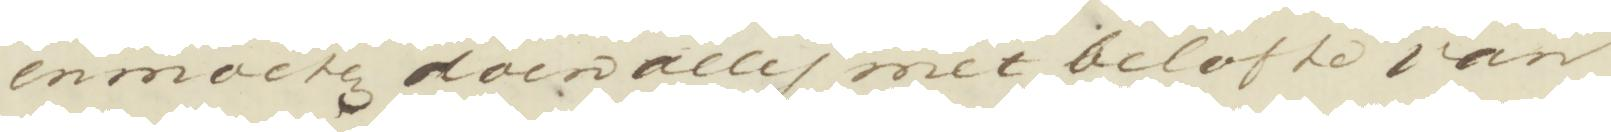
en moeten doen alles met belofte van
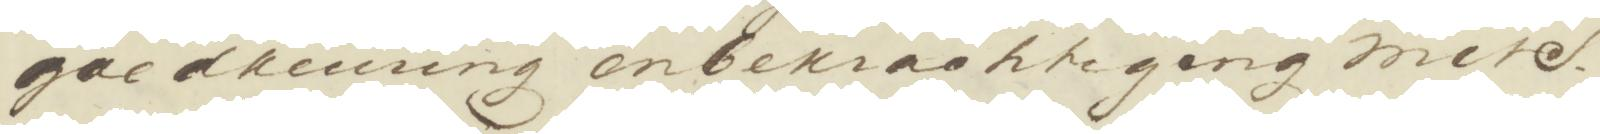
goedkeuring en bekrachtiging mits.
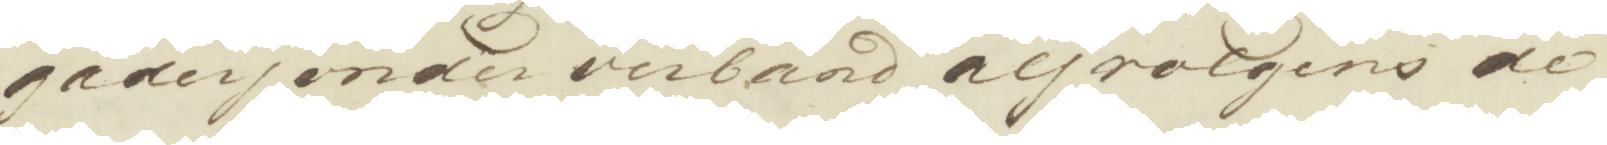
gaders onder verband als volgens de
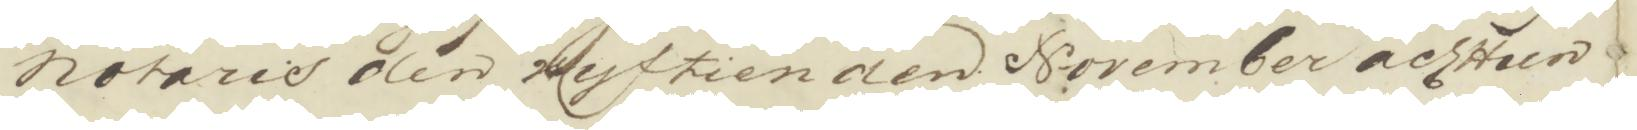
notaris den vyftienden November achttien
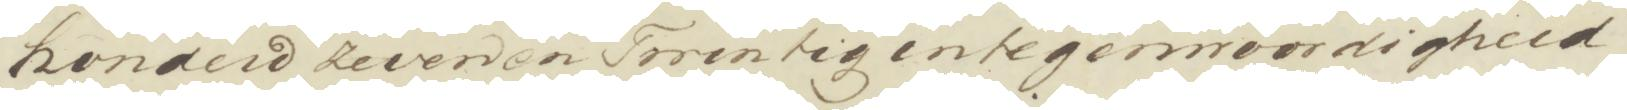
honderd zeven en Twintig in tegenwoordigheid
